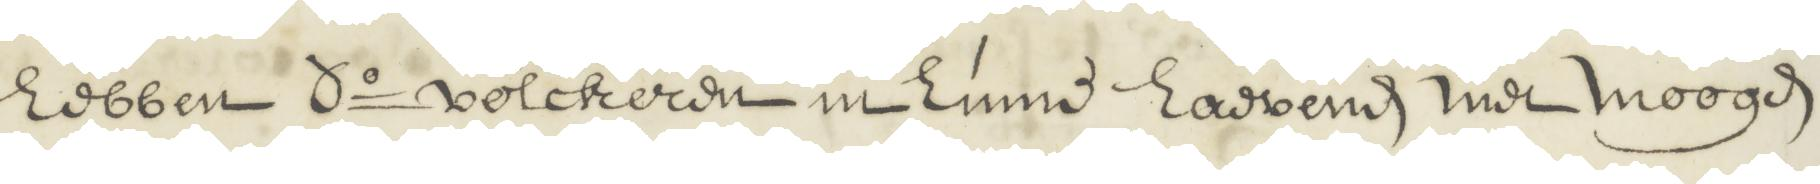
hebben d=o volckeren in hunne haevenen niet moogen
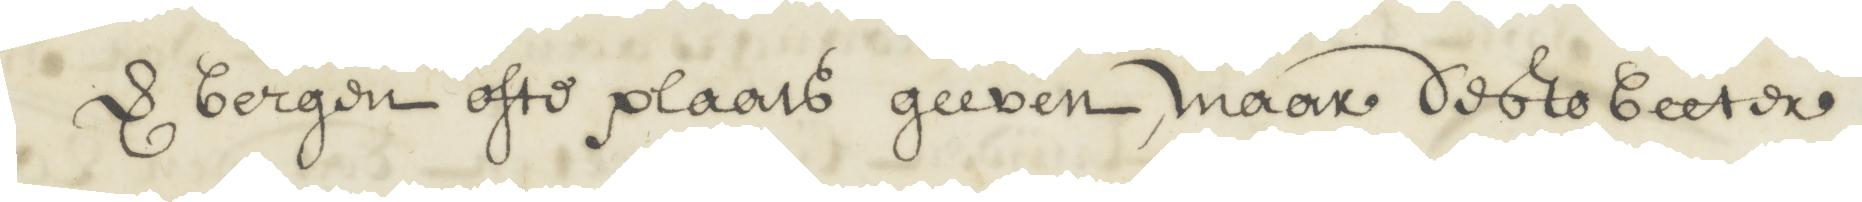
ver bergen ofte plaats geeven maar des te beeter
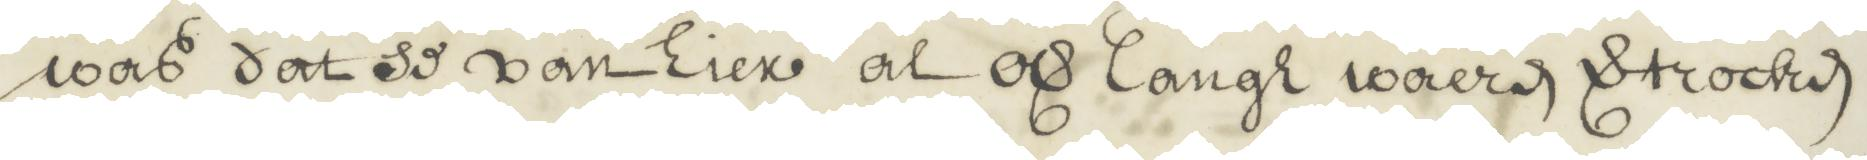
was dat se van hier al over langh waeren vertrocken
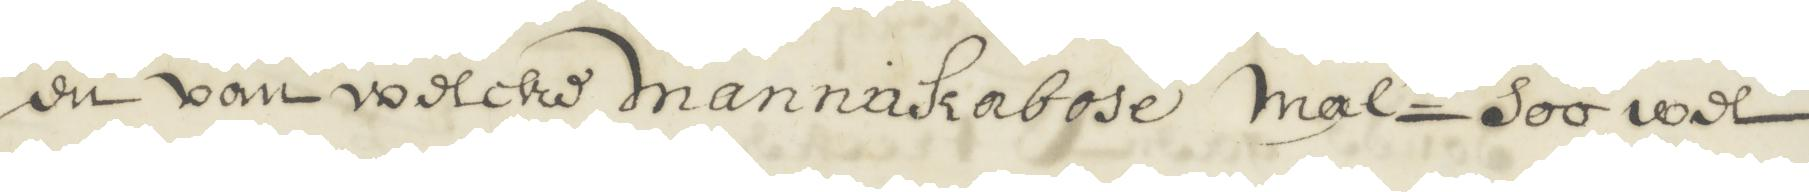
en van welcke mannakabose mal=rs soo wel
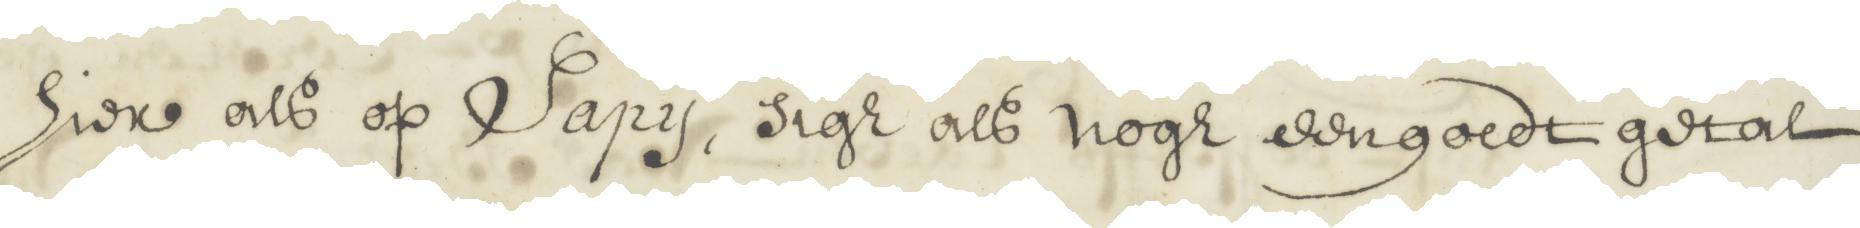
hier als op Sapij, sigh als nogh een goedt getal
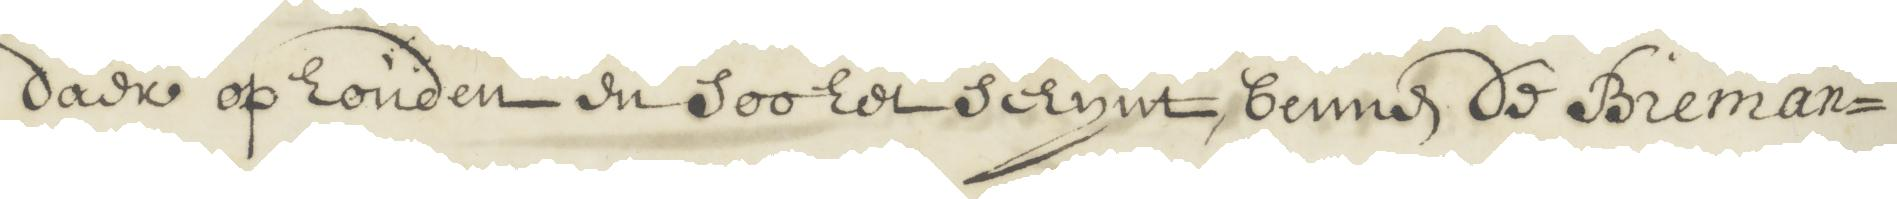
daer op houden en soo het schijnt, bennen de Bieman=sen
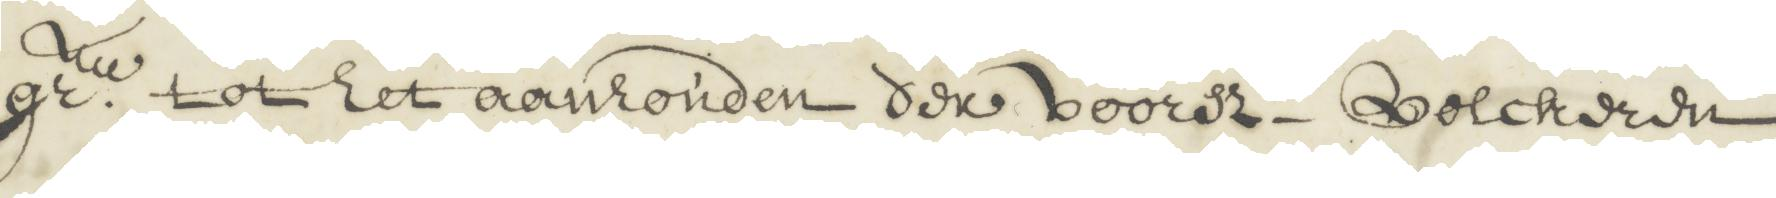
gr.e tot het aanhouden der voorsz-e volckeren
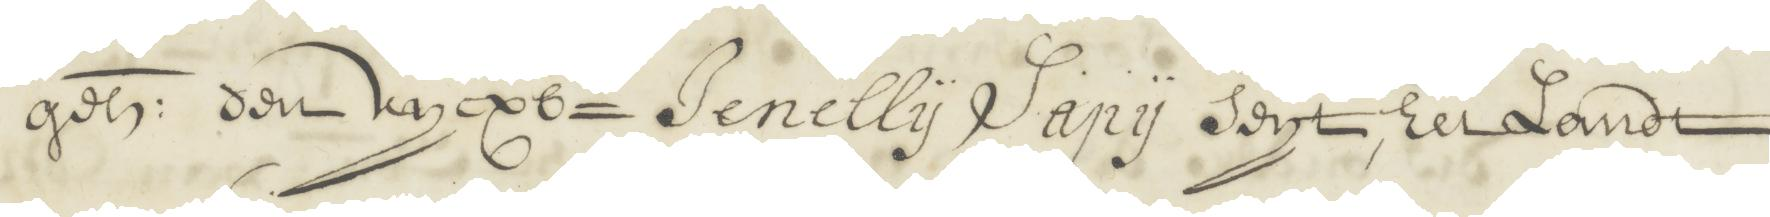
gelijk den rycxb=r Ienellij Sapij seyt, het Landt
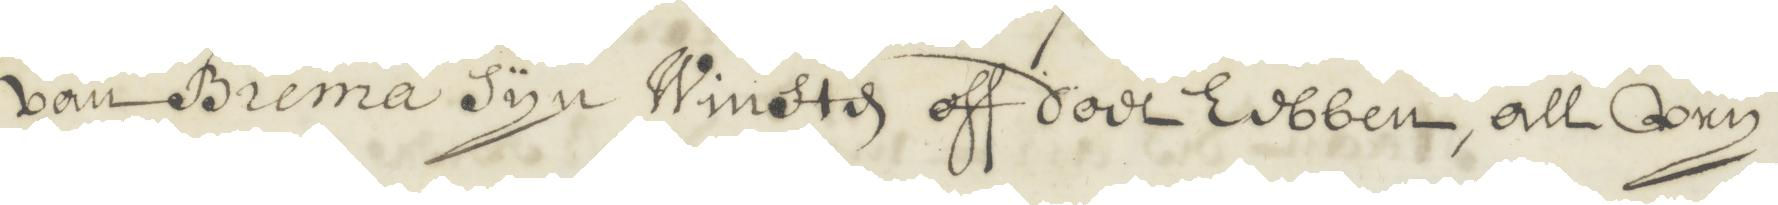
van Biema sijn Winsten off doet hebben, all vrij
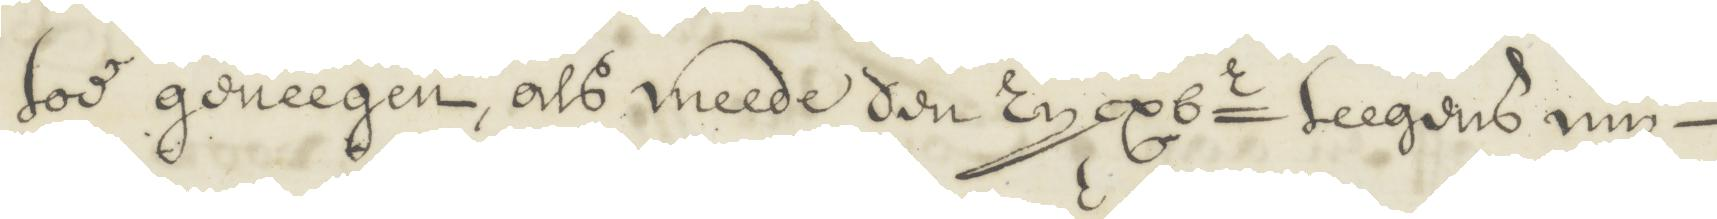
toe geneegen, als meede den rycxb=r teegens mij —
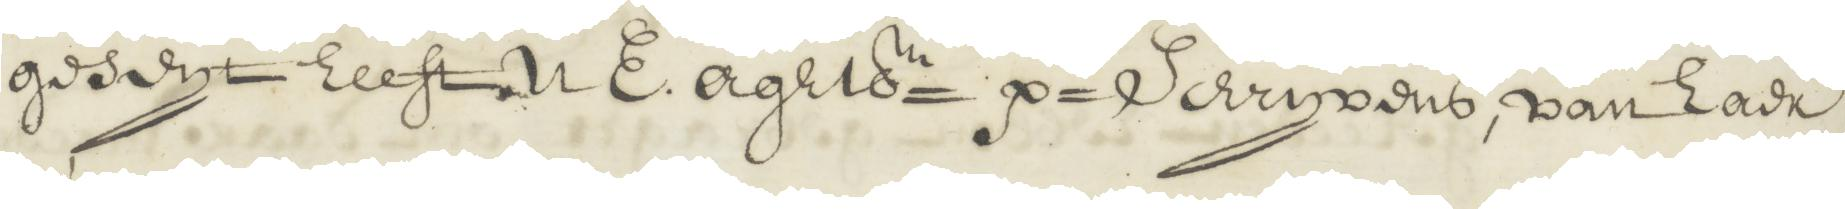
geseyt heeft uE. aghtb=r p=r Schryvens, van haer
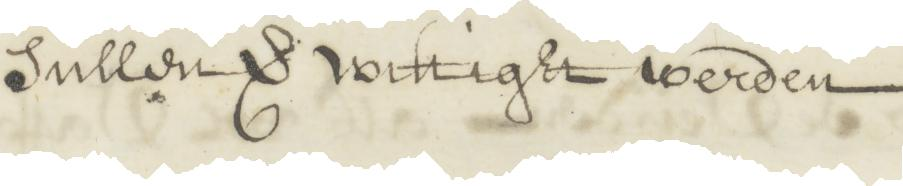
sullen verwittight werden
